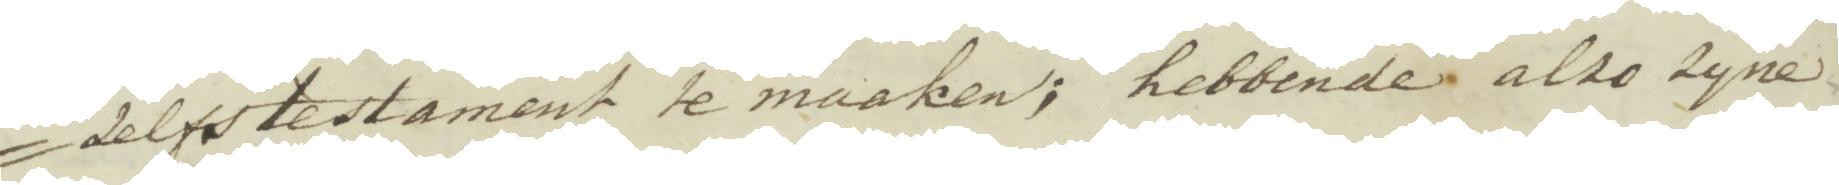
=zelfs testament te maaken; hebbende alzo zyne
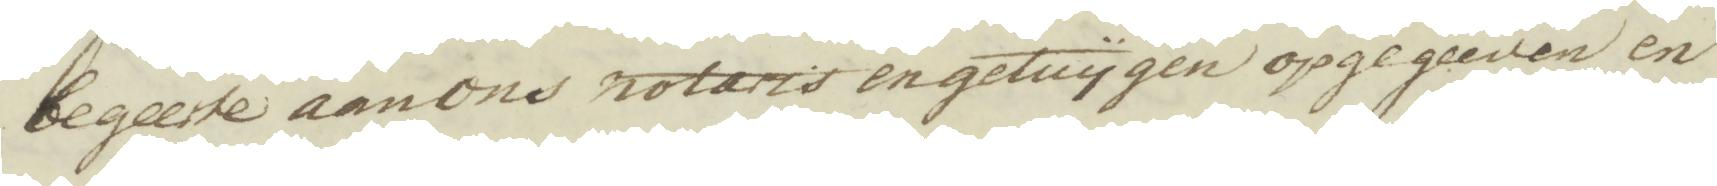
begeerte aan ons notaris en getuijgen opgegeeven en
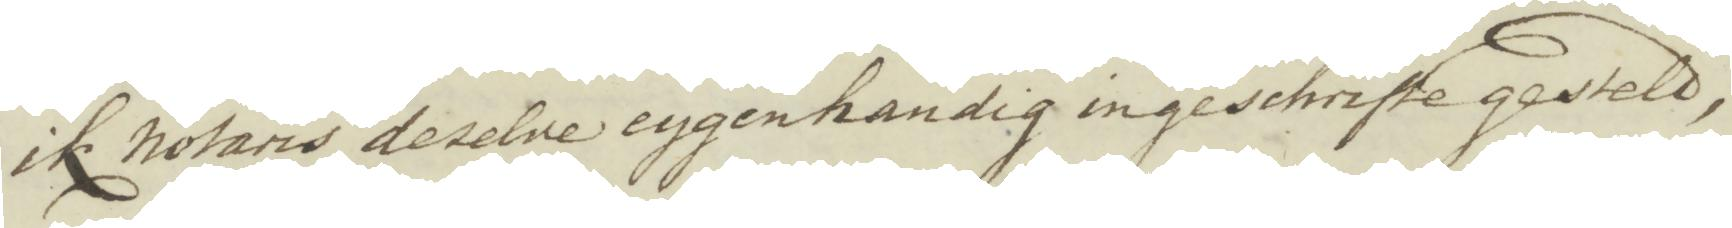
ik notaris dezelve eygenhandig ingeschrifte gesteld,
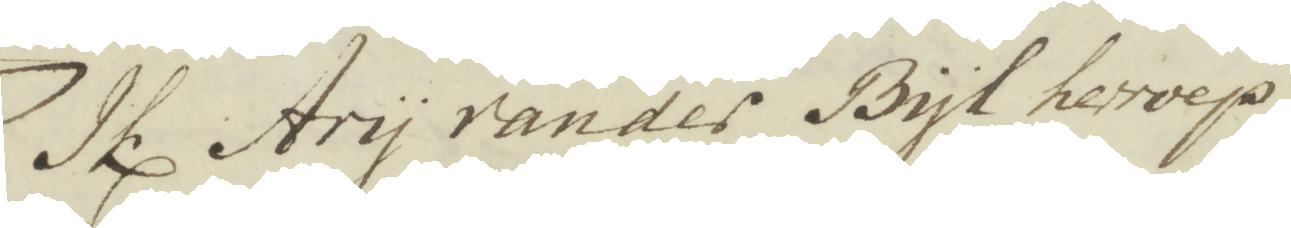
Ik Arij van der Bijl herroep
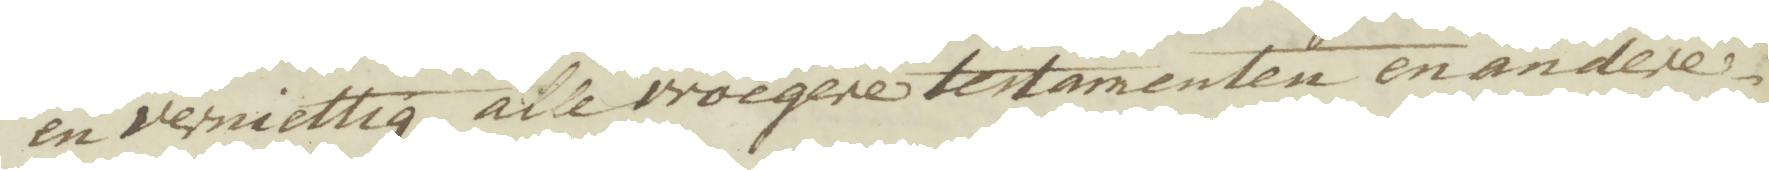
en verniettig alle vroegere testamenten en andere
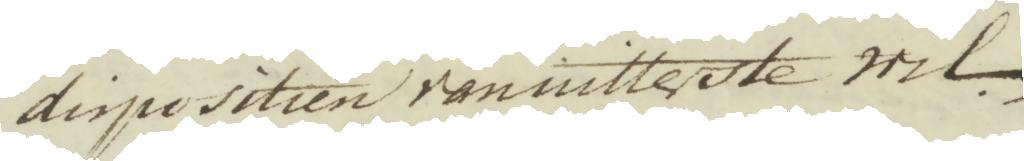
dispositien van uitterste wil.
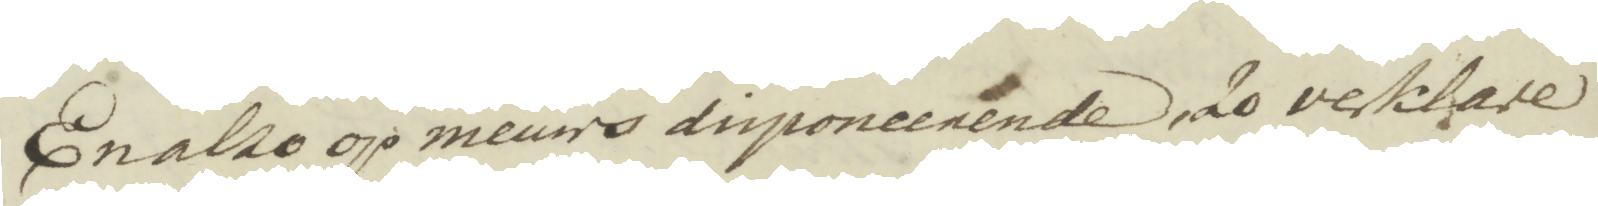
En alzo op nieuws disponeerende, zo verklare
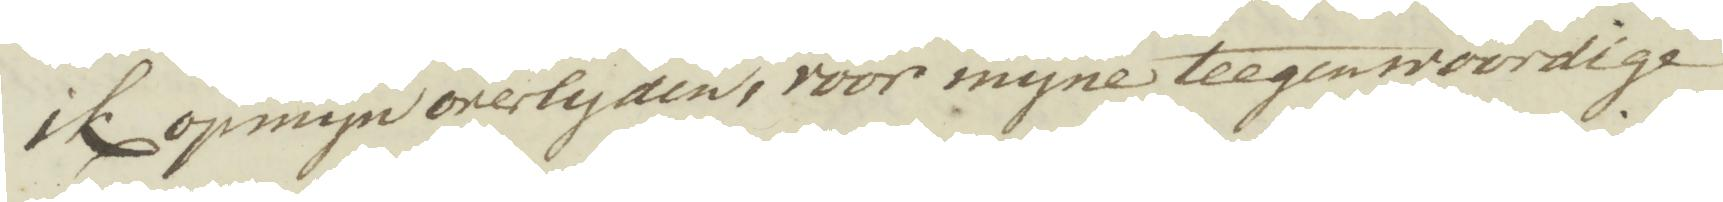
ik op myn overlyden, voor myne teegenwoordige
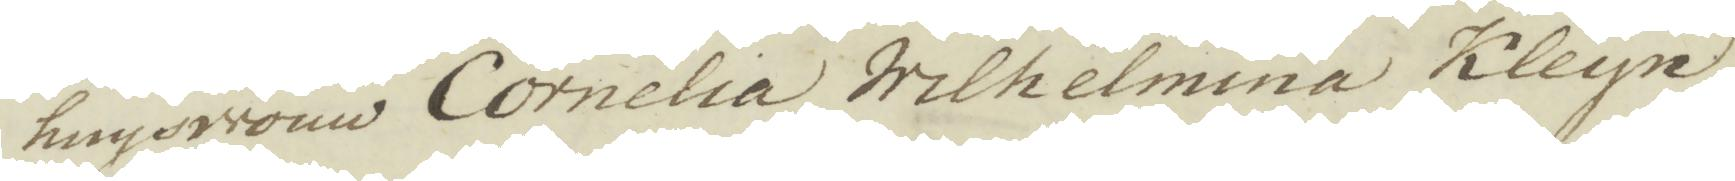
huysvrouw Cornelia Wilhelmina Kleyn,
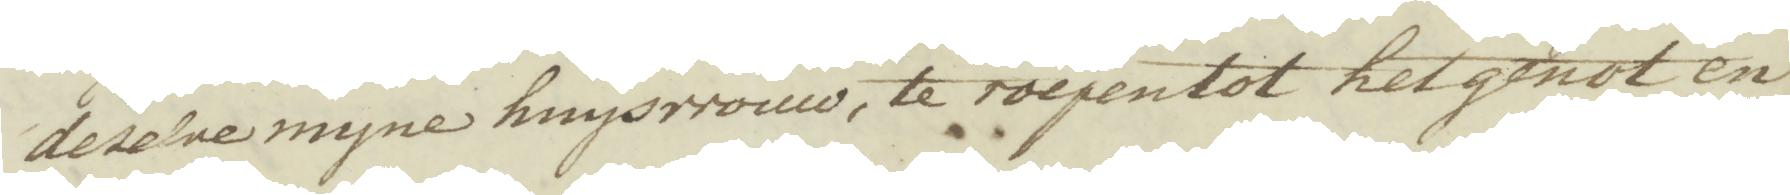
dezelve myne huysvrouw, te roepen tot het genot en
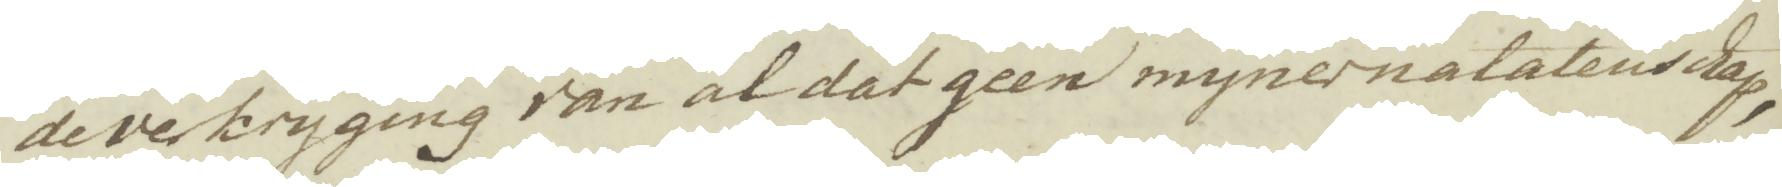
de verkryging van al dat geen myne nalatenschap,
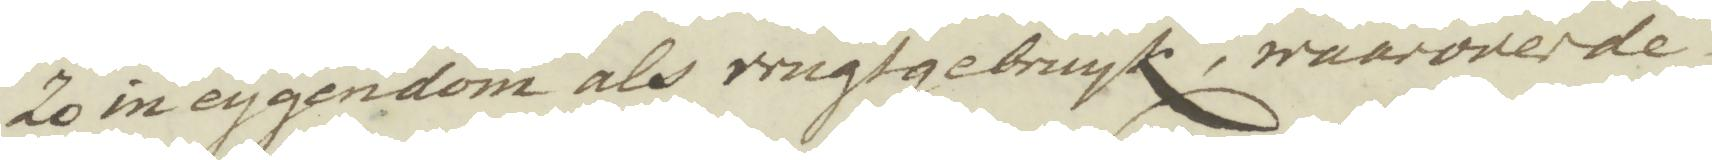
zo in eygendom als vrugtgebruyk, waar over de
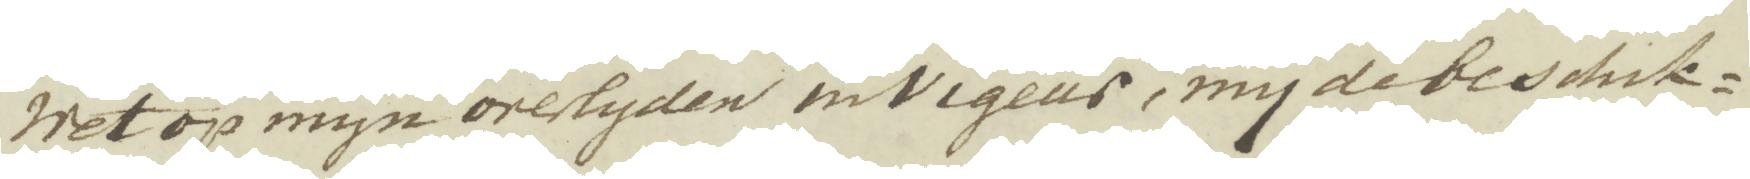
wet op myn overlijden in Vigeur, my de beschik=
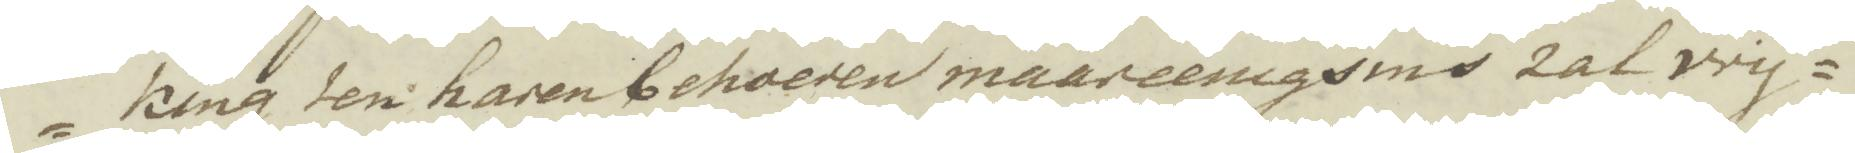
=king ten haren behoeven maar eenigsins zal vrij=
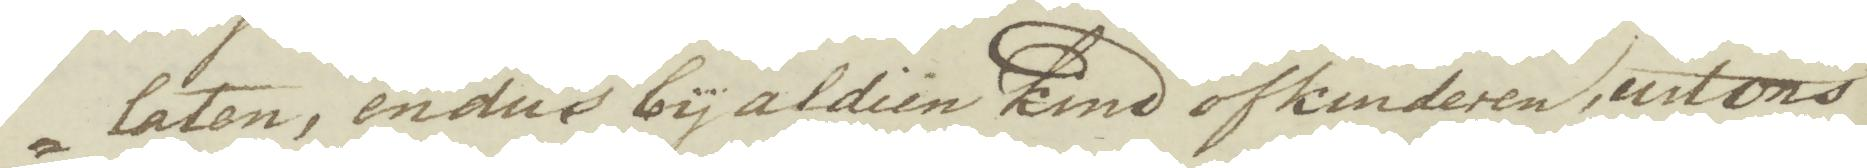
=laten, en dus bij aldien kind of kinderen, uit ons
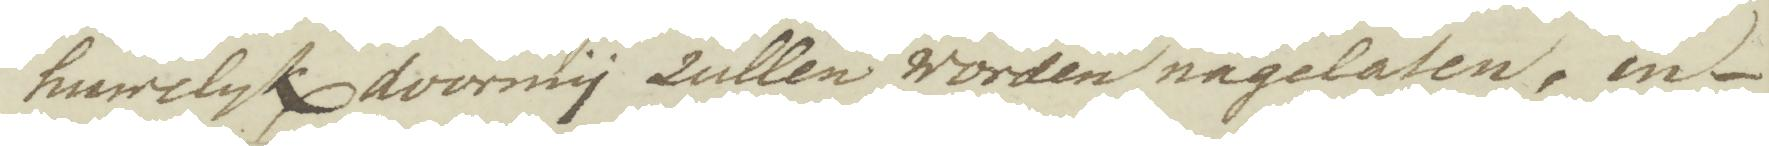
huwelijk door mij zullen worden nagelaten, in —
